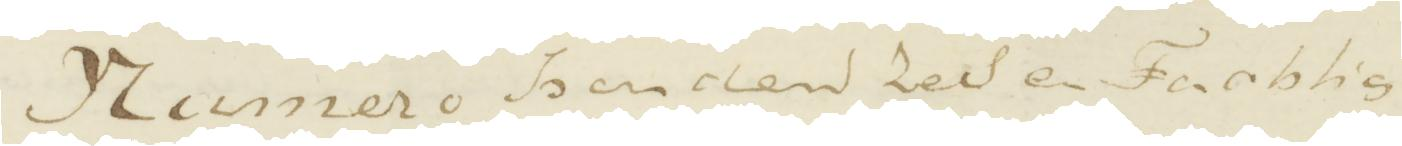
Numero honderd zes en Tachtig
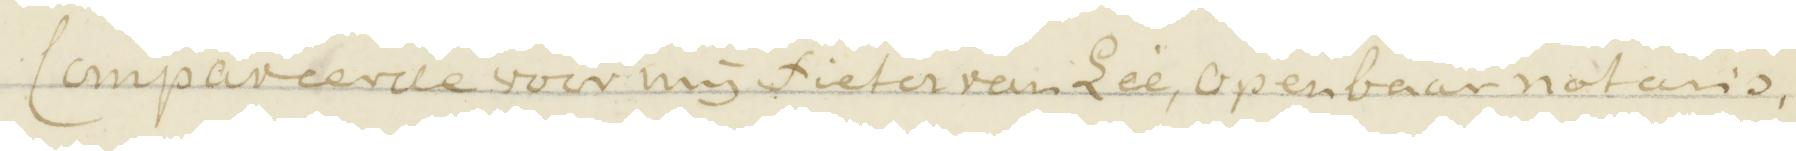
Compareerde voor mij Pieter van Leè, openbaar notaris,
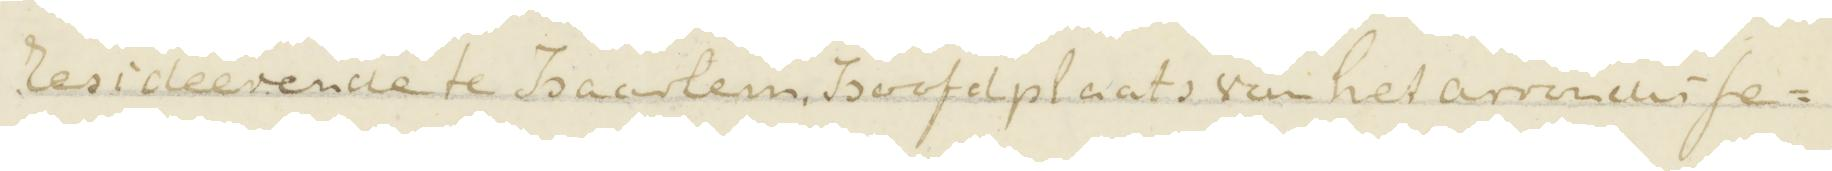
resideerende te Haarlem, hoofdplaats van het arrondisse=
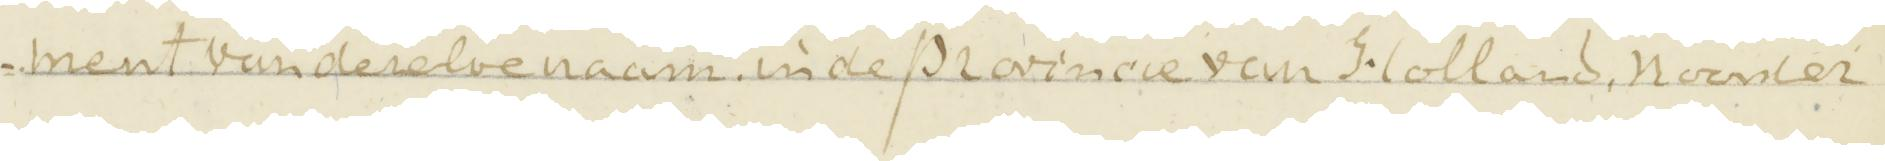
=ment van dezelve naam, in de provincie van Holland, Noorder
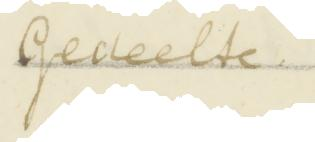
Gedeelte.
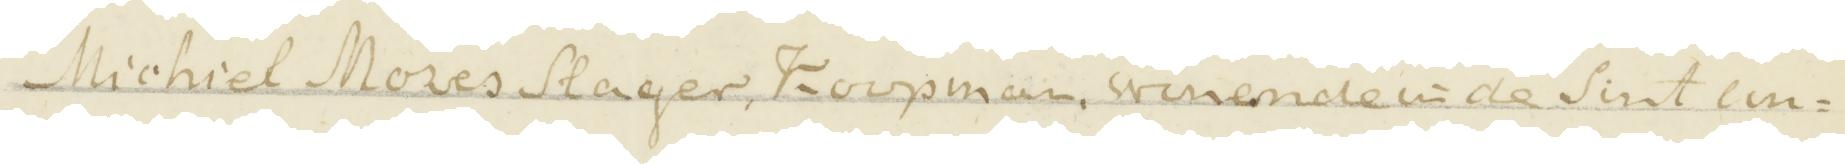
Michiel Mozes Slager, Koopman, wonende de Sint an=
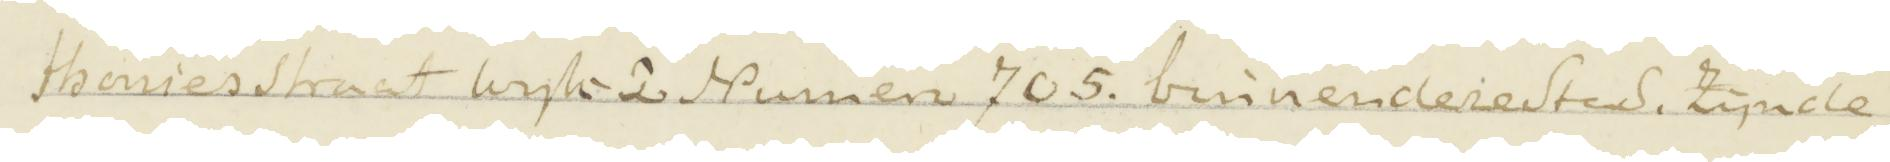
thoniestraat wyk 2 Numero 705. binnen deze stad, zijnde
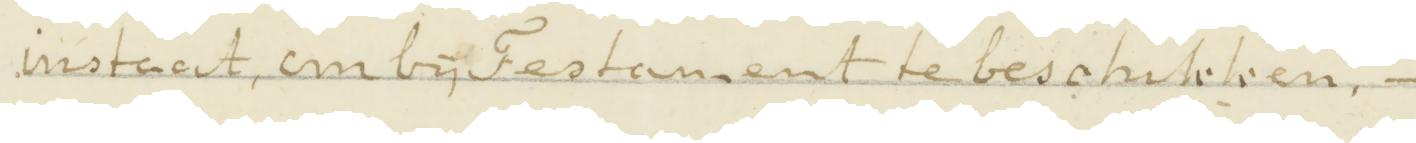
instaat, om bij Testament te beschikken.
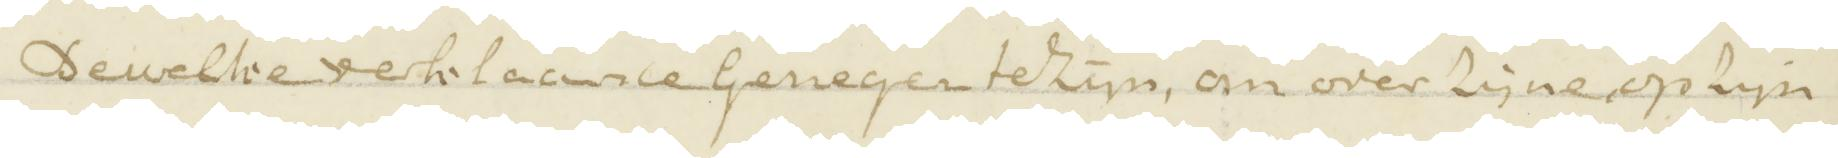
Dewelke verklaarde Genegen te zijn, om over zijne, op zijn
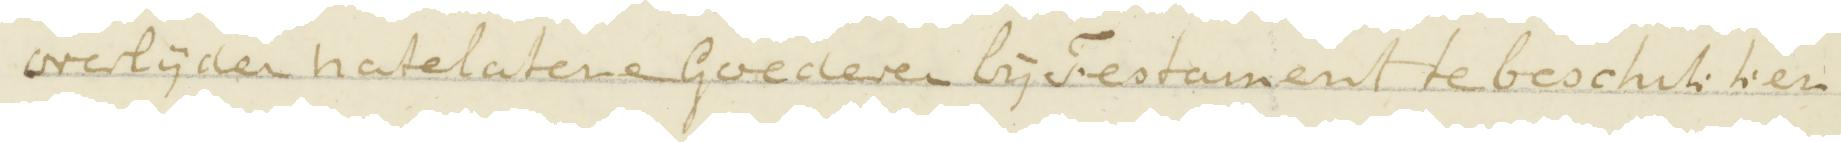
overlijden natelatene Goederen bij Testament te beschikken,
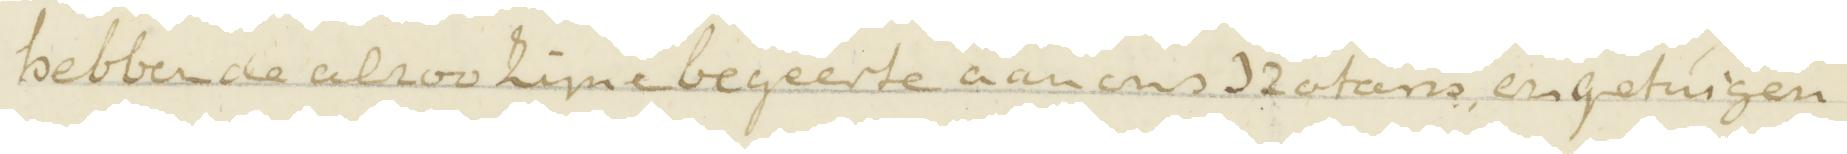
hebbende alzoo zijne begeerte aan Notaris, en getuigen
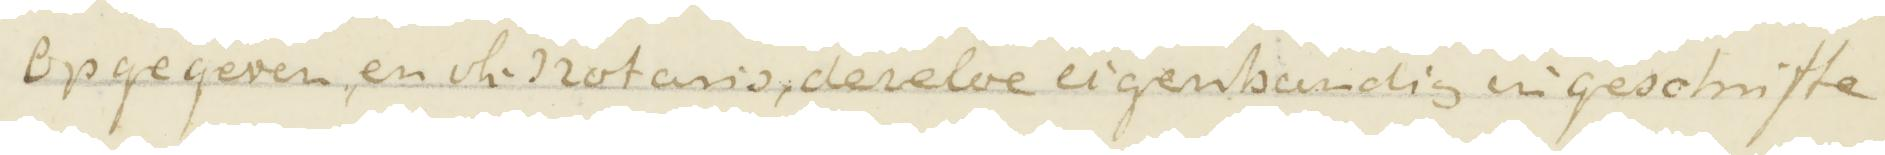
opgegeven, en ik notaris, dezelve eigenhandig in geschrifte
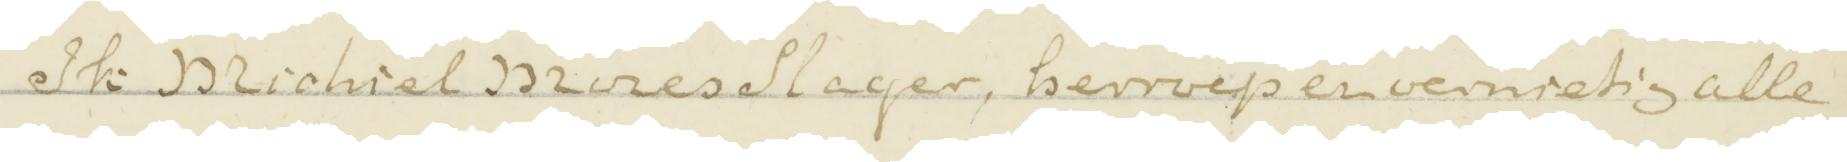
Jk Michiel Mozes Slager, herroep en vernietig alle
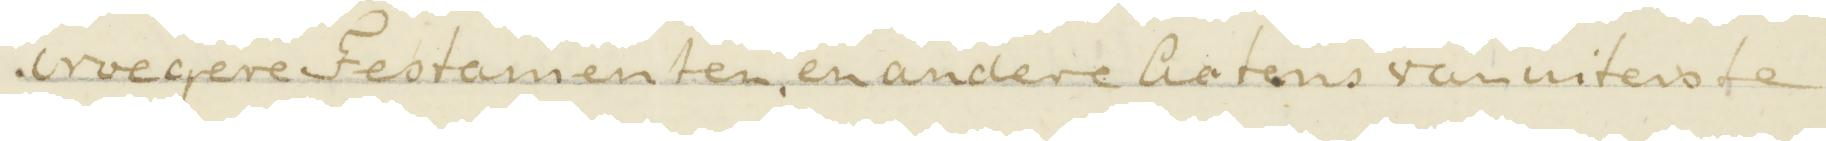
vroegere Testamenten, en andere Actens van uiterste
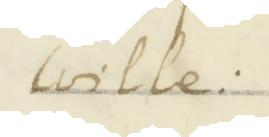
wille:
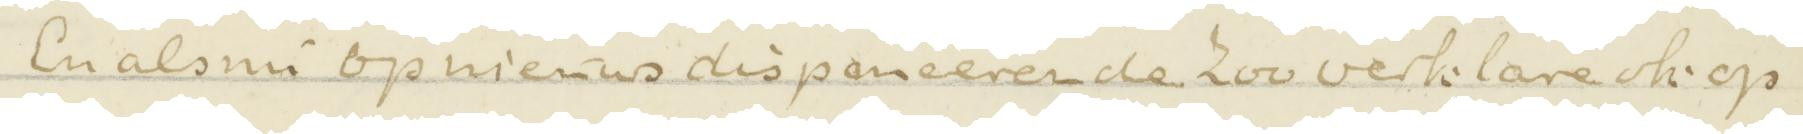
En als nu opnieuws disponeerende zoo verklare ik op
